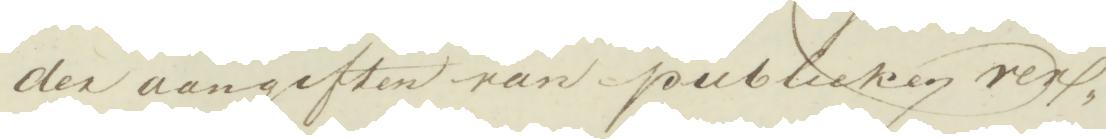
der aangiften van publieken ver„
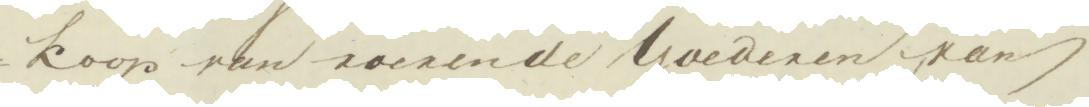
„koop van roerende Goederen van
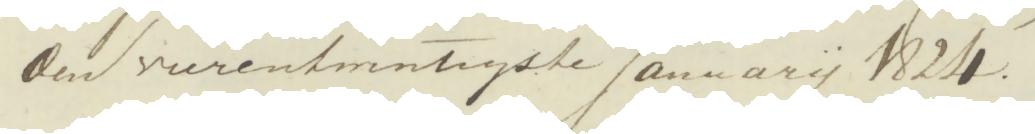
den vierentwintigste Januarij 1824.
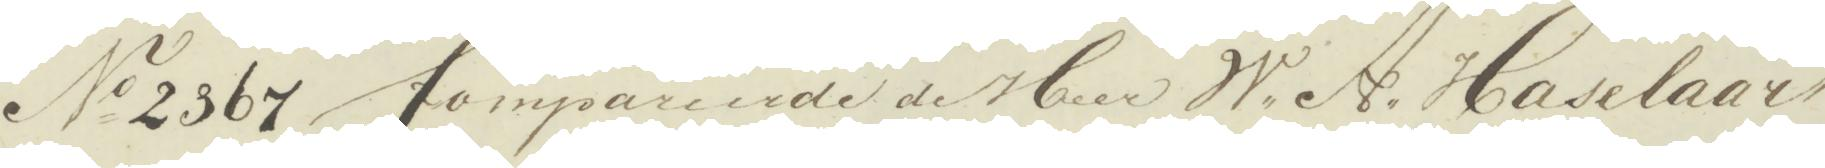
N=o 2367 Compareerde de Heer W„ A„ Haselaar,
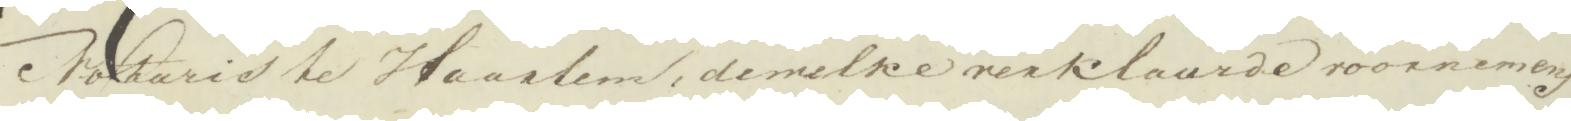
Notaris te Haarlem, dewelke verklaarde voornemen
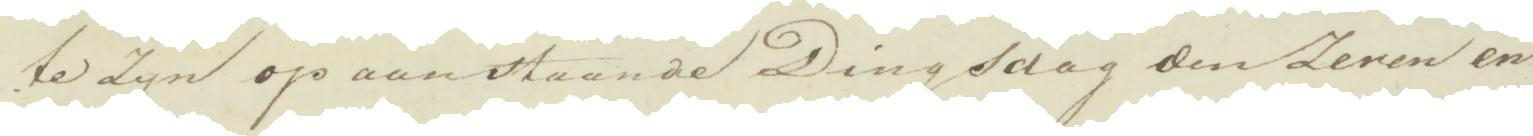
=te zyn op aanstaande Dingsdag den Zeven en
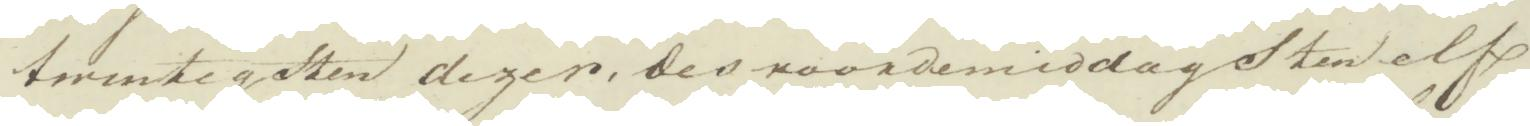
twintigsten dezer, des voordemiddags ten elf
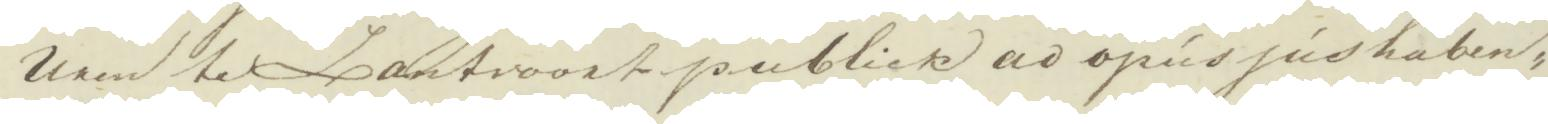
uren te Zantvoort publiek ad opus jus haben„
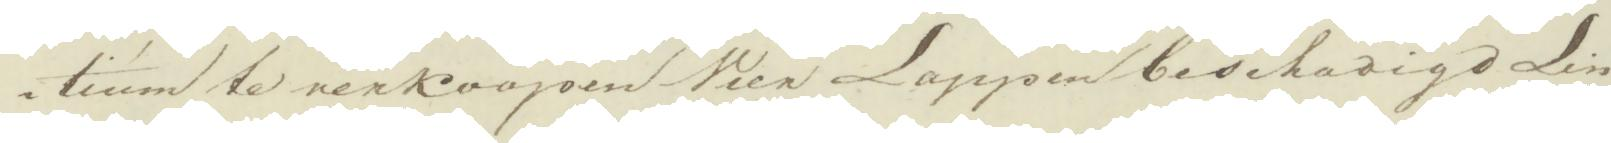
=tium te verkoopen Vier Lappen beschadigd Lin
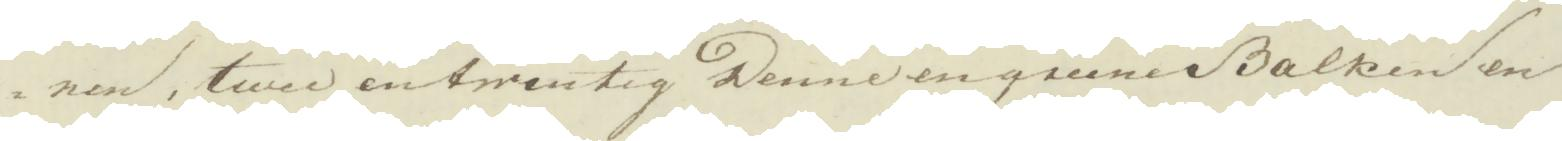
=nen, twee en twintig Denne en greene Balken en
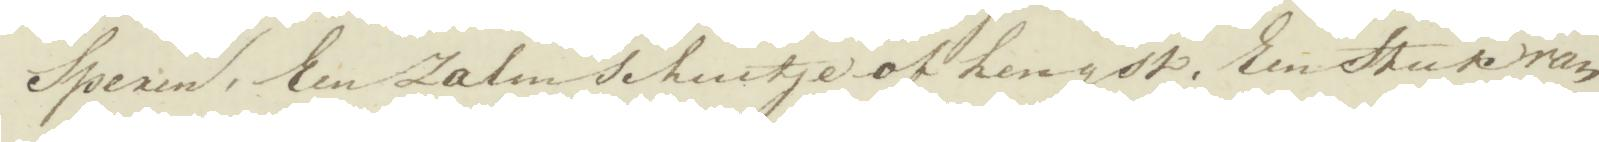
Speren, Een zalm schuitje of hengst, Een stuk van
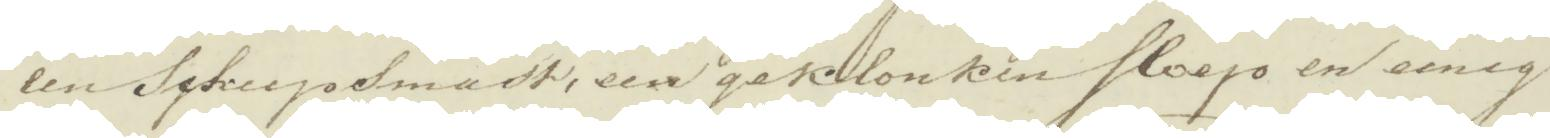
een scheepsmast, een geklonken sloep en eenig
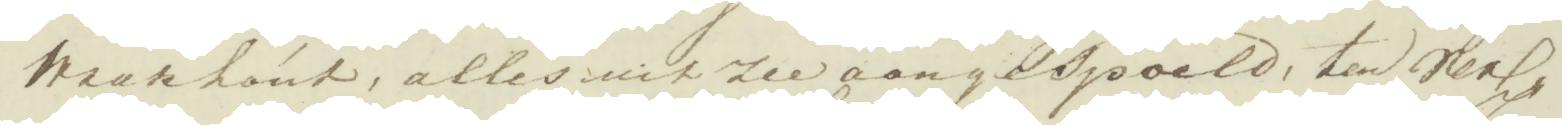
Wrakhout, alles uit zee aangespoeld, ten ver„
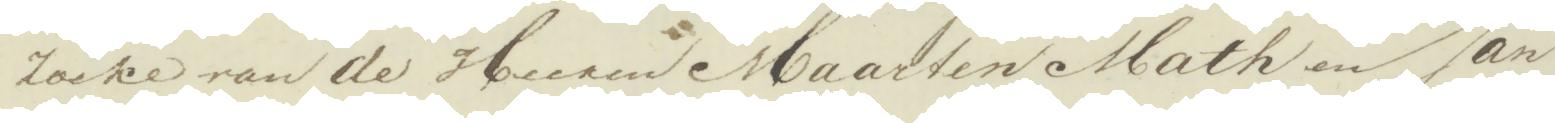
zoeke van de Heeren Maarten Math en Jan
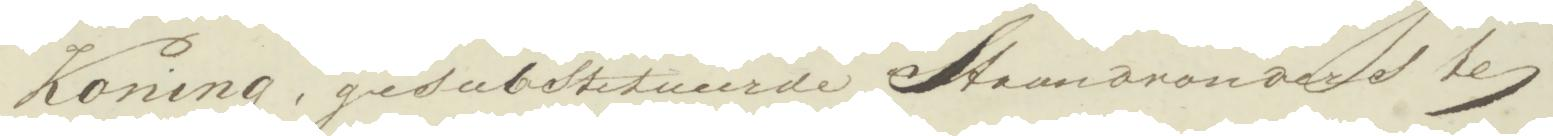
Koning, gesubstitueerde Strandvonders ten
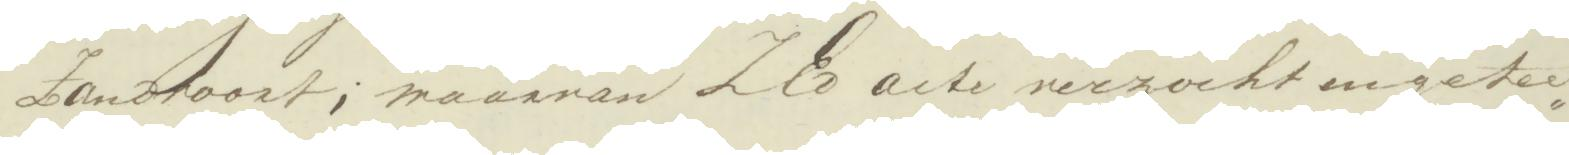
Zandvoort; waarvan ZEd acte verzocht en getee„
